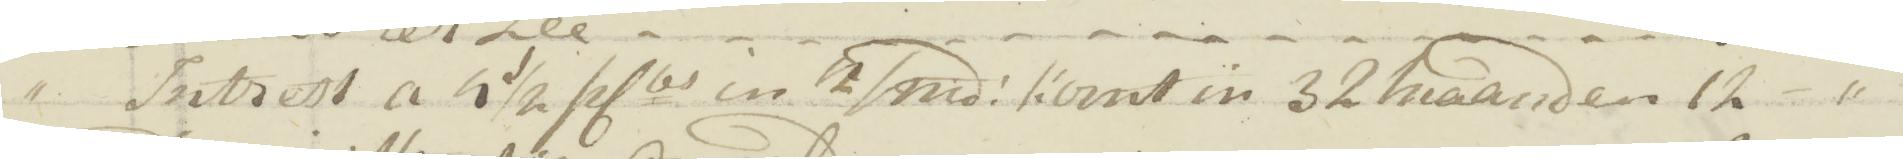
„ Intrest a 4½ pC=tes in 12/Md: komt in 32 maanden 12 — „
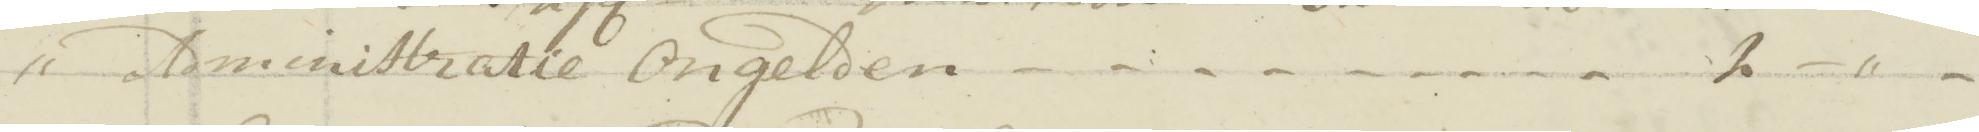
„ Administratie Ongelden - - - - - - - - - 2 — „ -
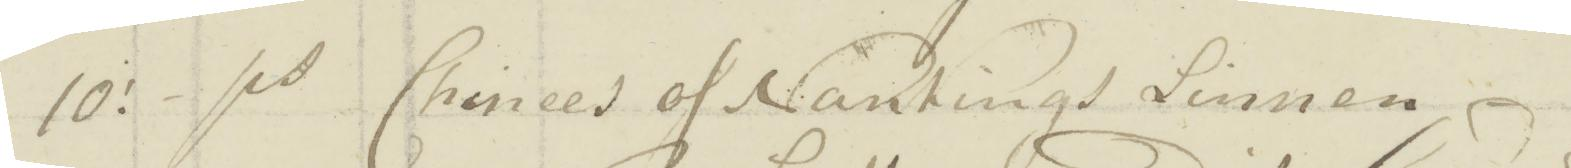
10: - ps Chinees of Nankings Linnen —
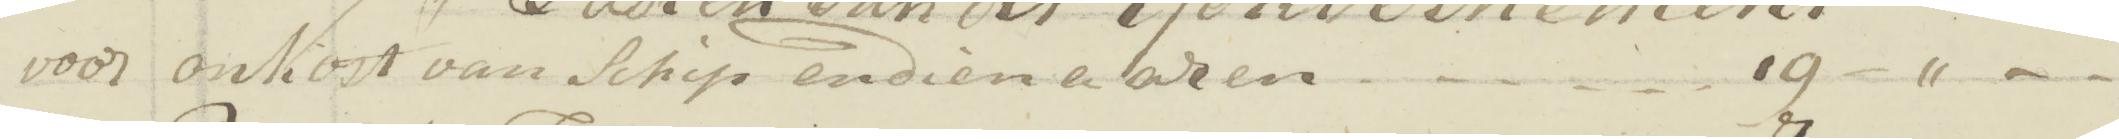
voor onkost van schip en dienaaren - - - - - - 19 — „ - -
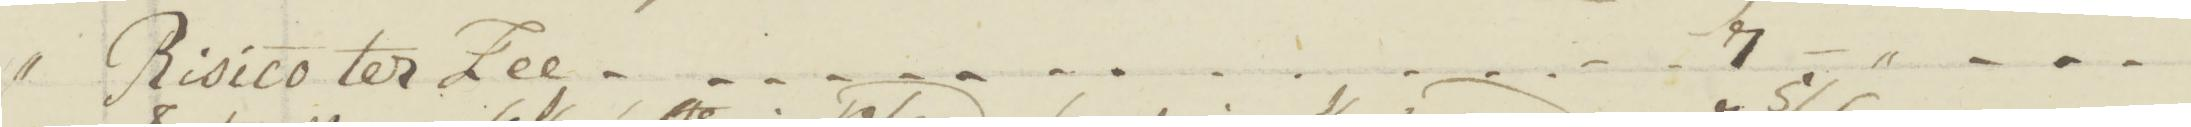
„ Risico ter Zee - - - - - - - - - - - - - - 7 — „ - - -
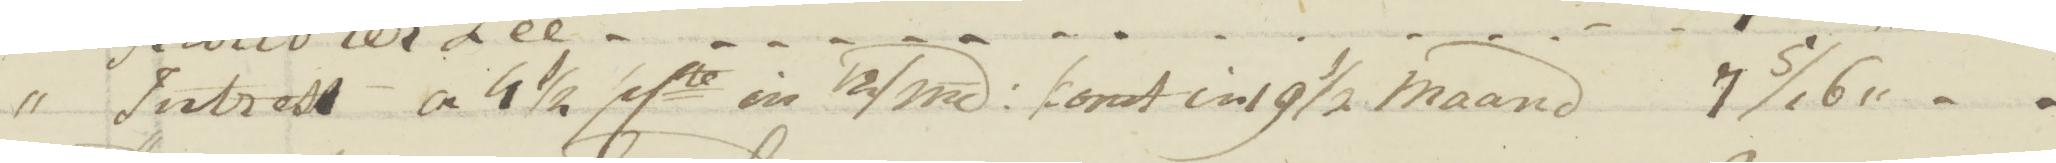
„ Intrest a 4½ pC=te in 12/md: komt in 19½ maand 7 5/16„ -
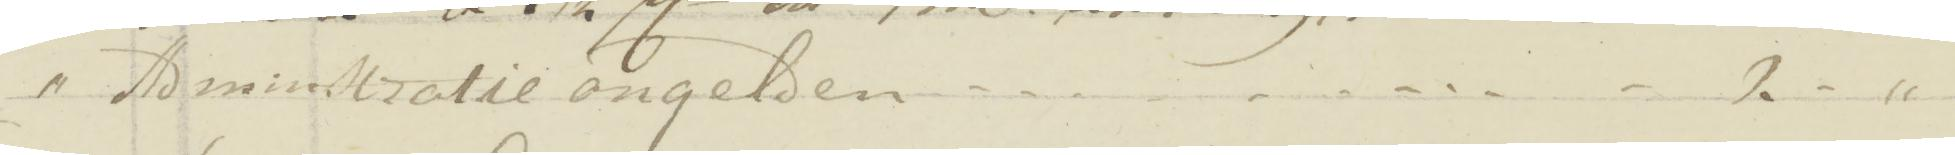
„ Adminstratie ongelden - - - - - - - - - - 2 - „
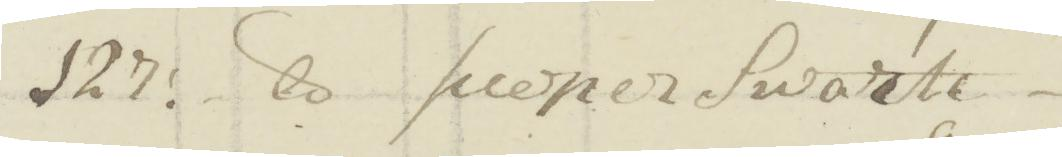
127: lb peeper swarte -
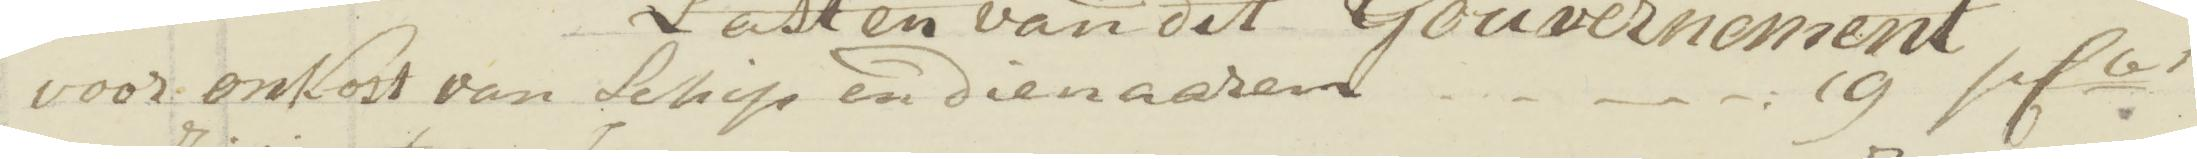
voor onkost van schip en dienaaren - - - - - : 19 pC=tes
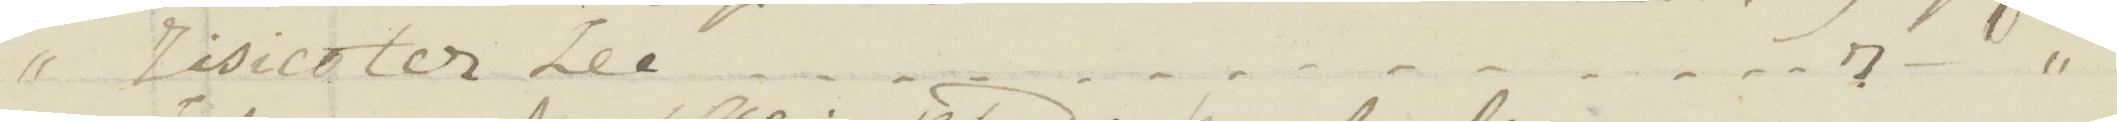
„ Risico ter Zee - - - - - - - - - - - - - - 7 — „
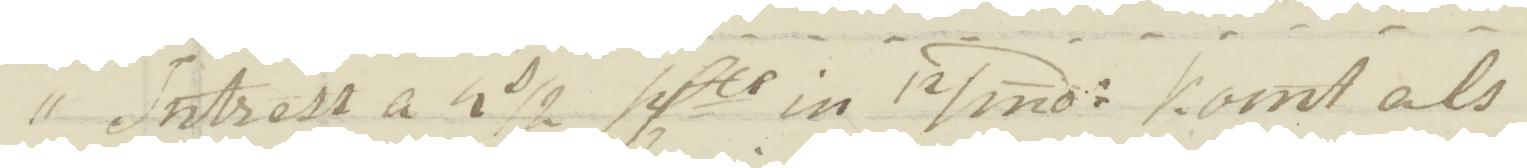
„ Intrest a 4½ pC=ts in 12/md: komt als
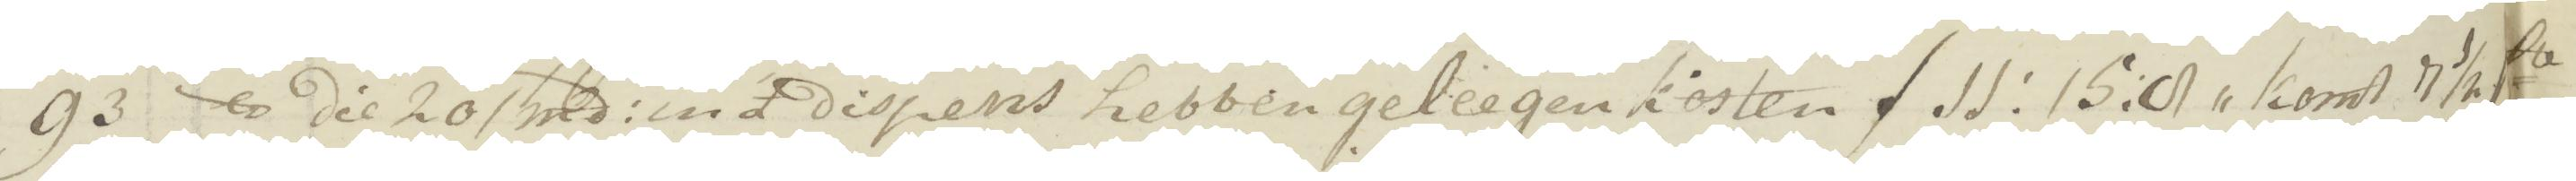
93 lb die 20/md: in ’t dispens hebben geleegen kosten ƒ 11: 15:8 „ komt 7½ p=te
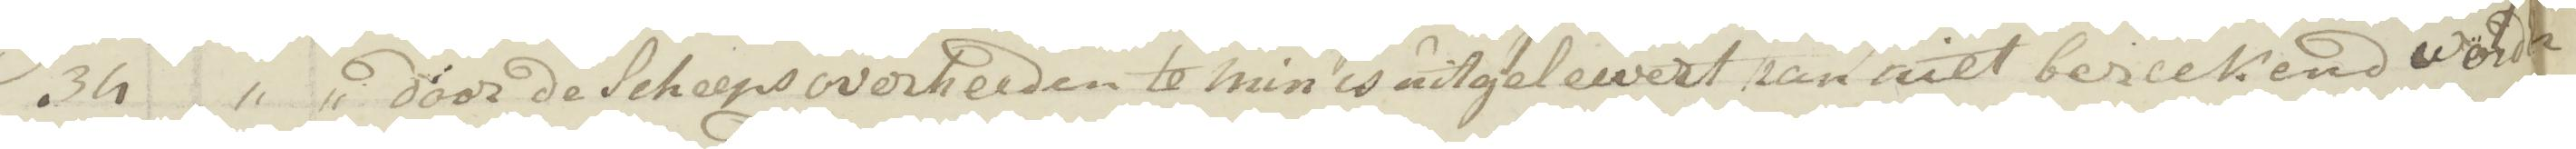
34 „ „ door de scheeps overheeden te min is uitgeleevert van niet bereekend word
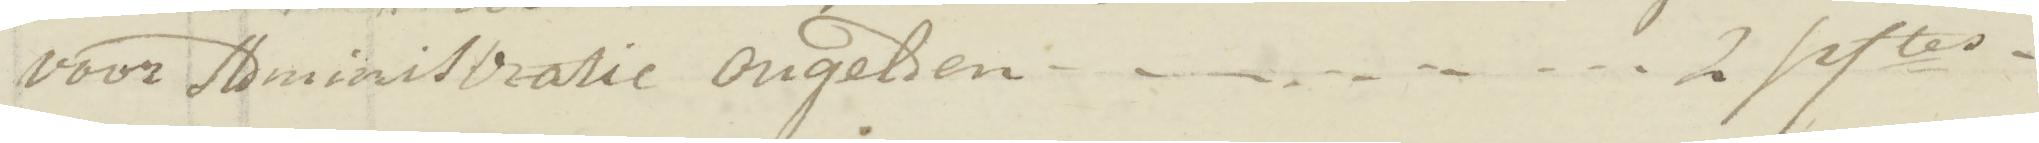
voor Administratie ongelden - - - - - - - - 2 pC=tes -
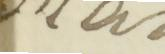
Tra
